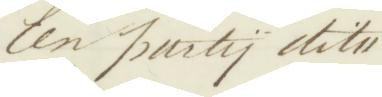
Een partij dito
